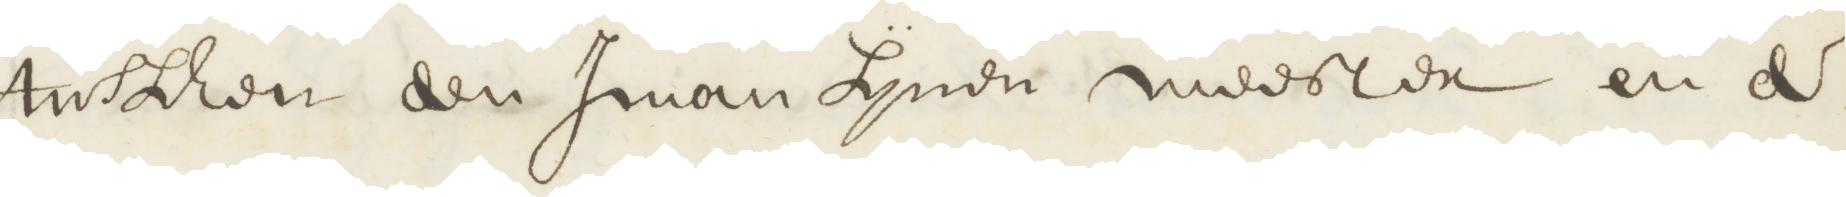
tusschen den Jman sijnen meester en de
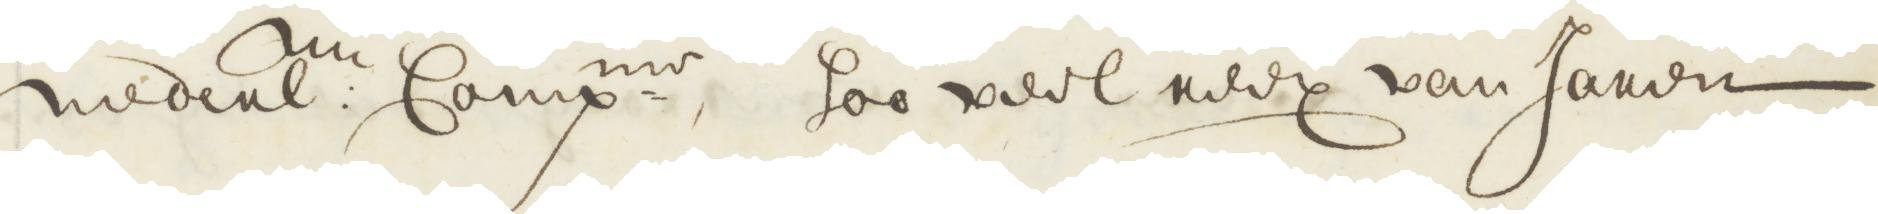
nederl: Comp=nie, soo veel reex van Jaren
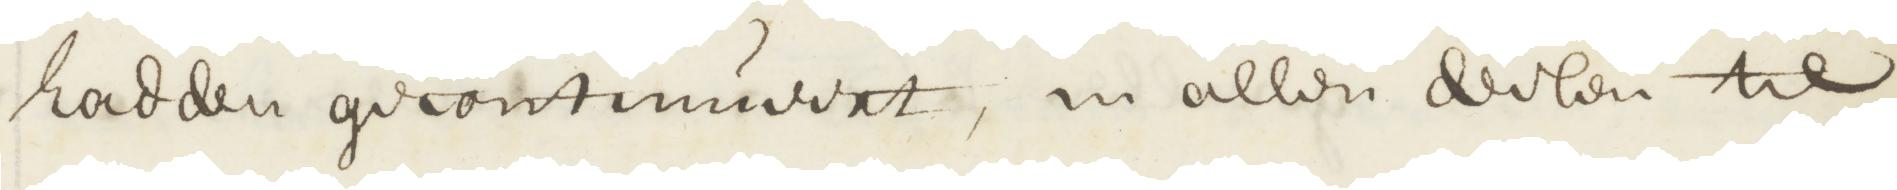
hadden gecontinueert, in allen deelen te
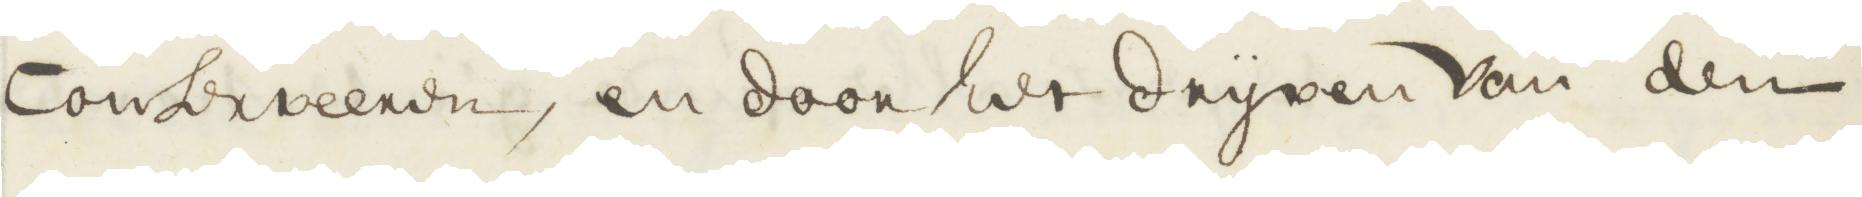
conserveeren, en door het drijven van den
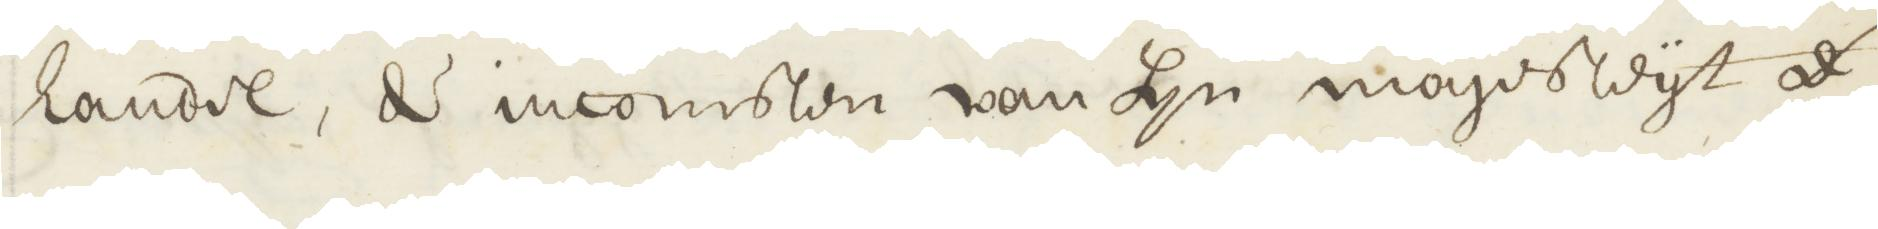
handel, de incomsten van sijn majesteijt te
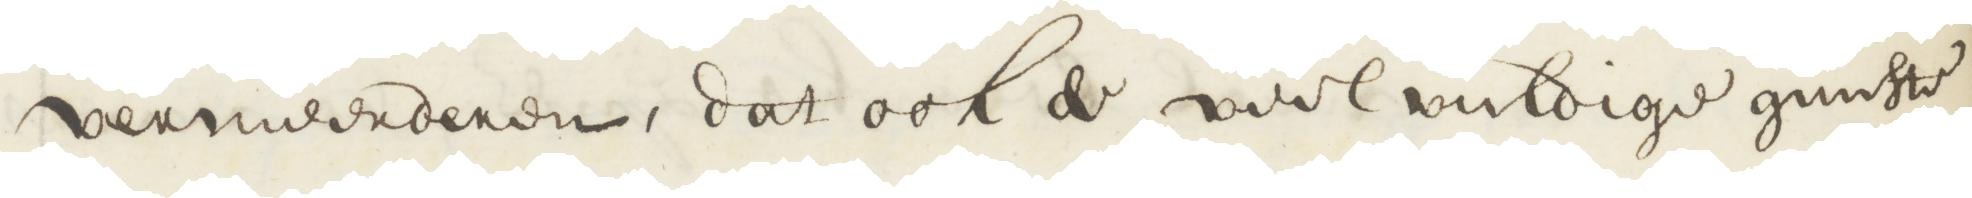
vermeerderen, dat ook de veel vuldige gunste
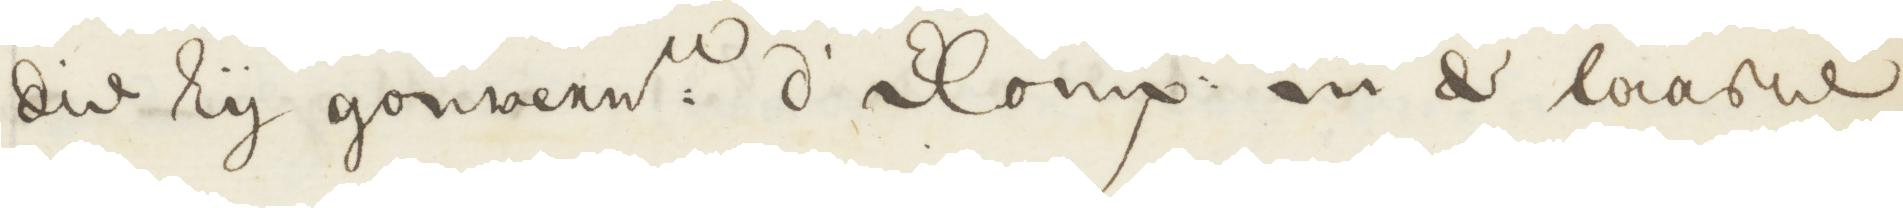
die hij gouvern=r d' EComp:nie in de laaste
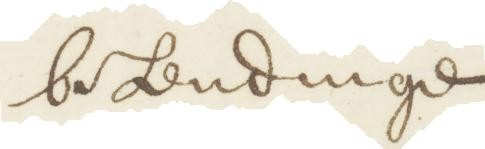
besendinge
